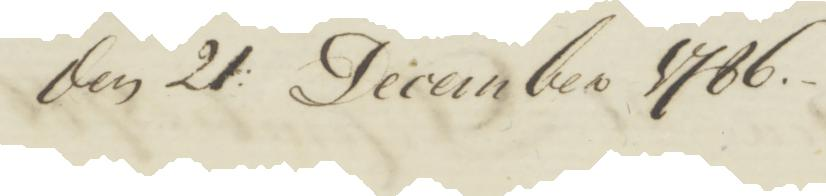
den 21: December 1786. —
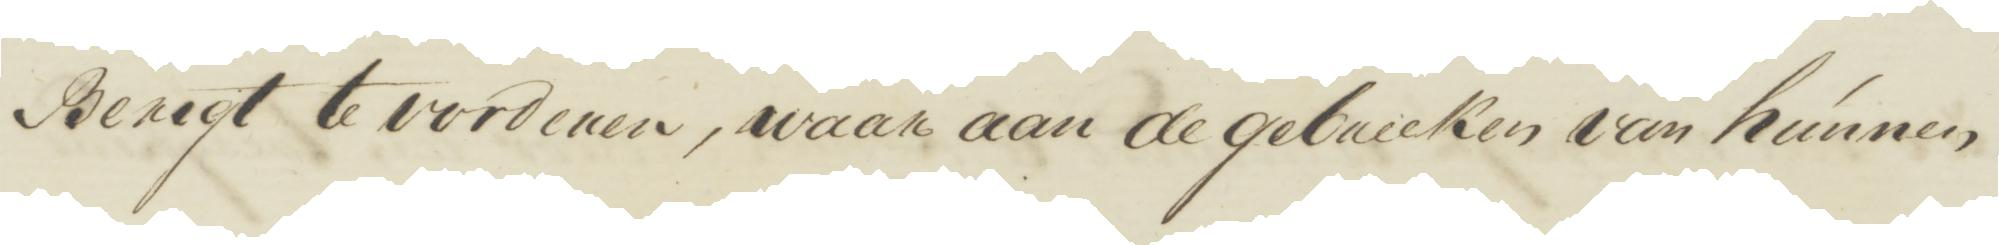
Berigt te vorderen, waar aan de gebreeken van hunnen
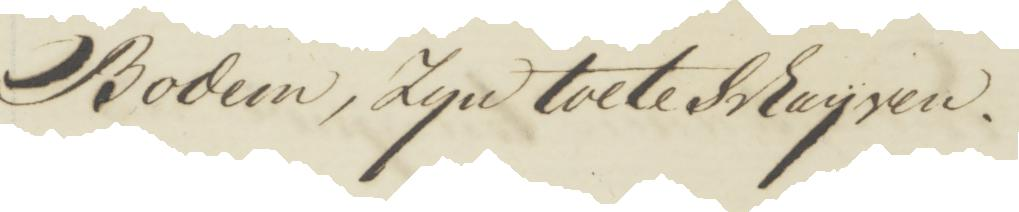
Bodem, zyn toe te schrijven.
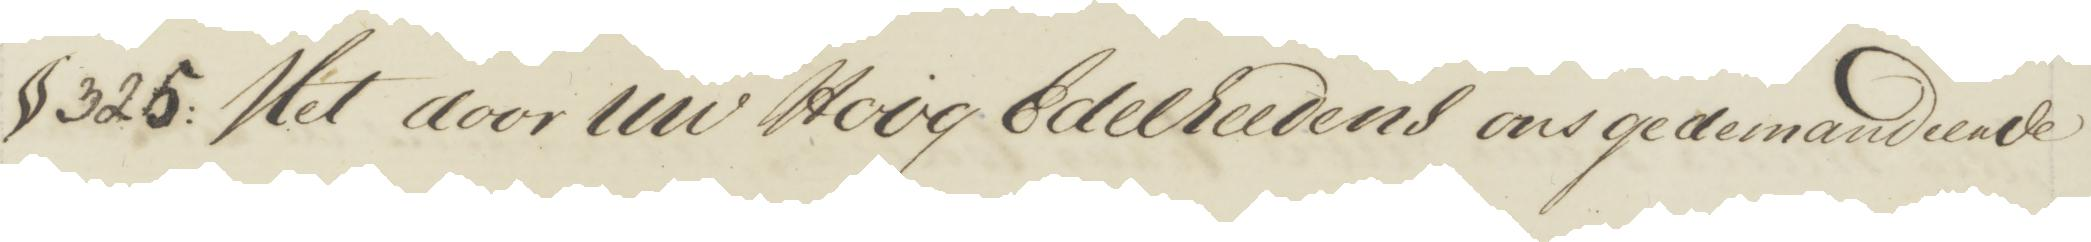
§ 325: Het door uw Hoog Edelheedens ons gedemandeerde
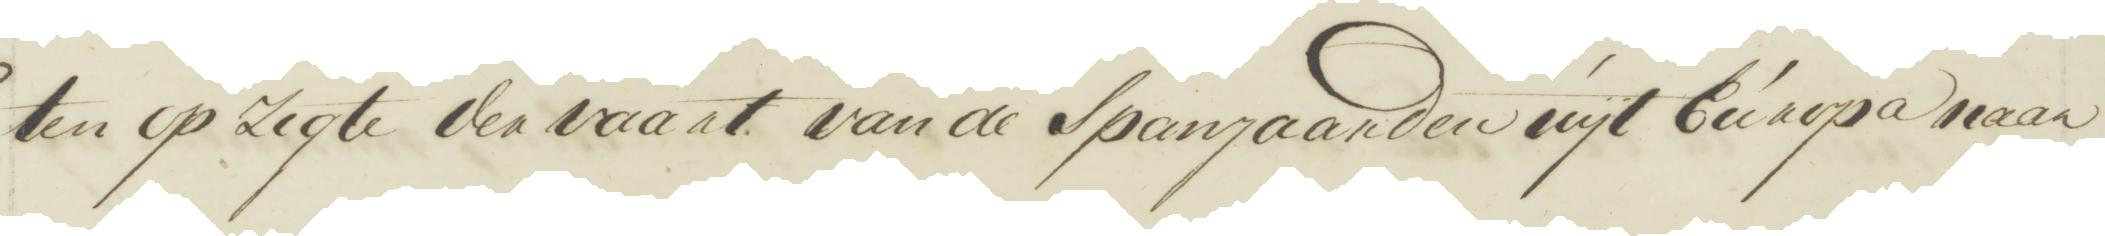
ten op zigte der vaart van de spanjaarden uijt Europa naar
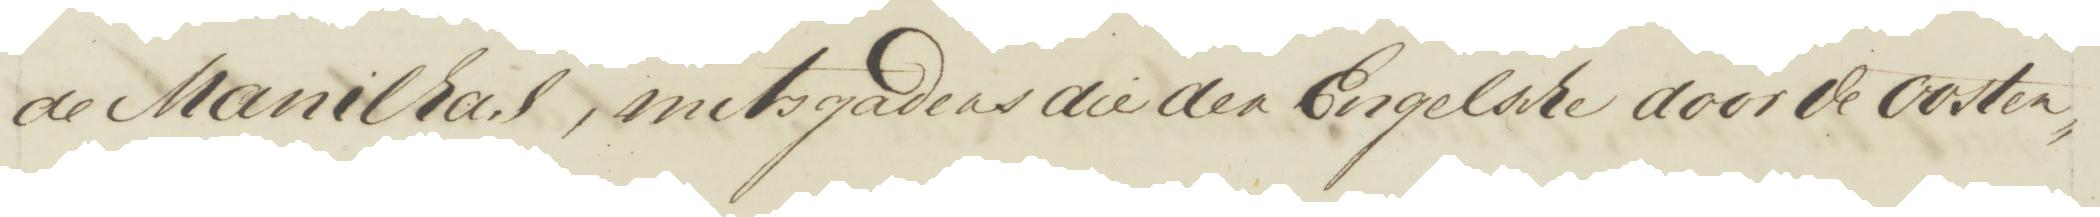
de Manilhas, mitsgaders die der Engelsche door de ooster„
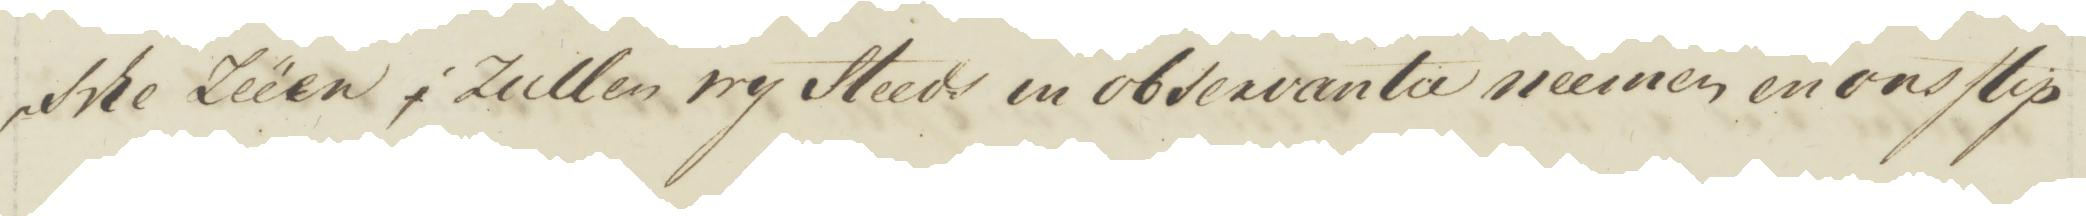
„sche zeëen; zullen wy steeds in observantie neemen en ons stip
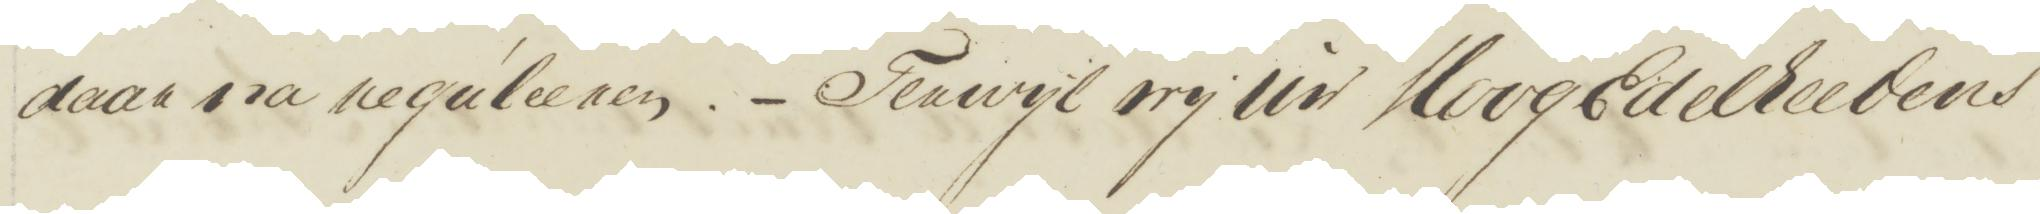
daar na reguleeren. — Terwijl wij uw Hoog Edelheedens
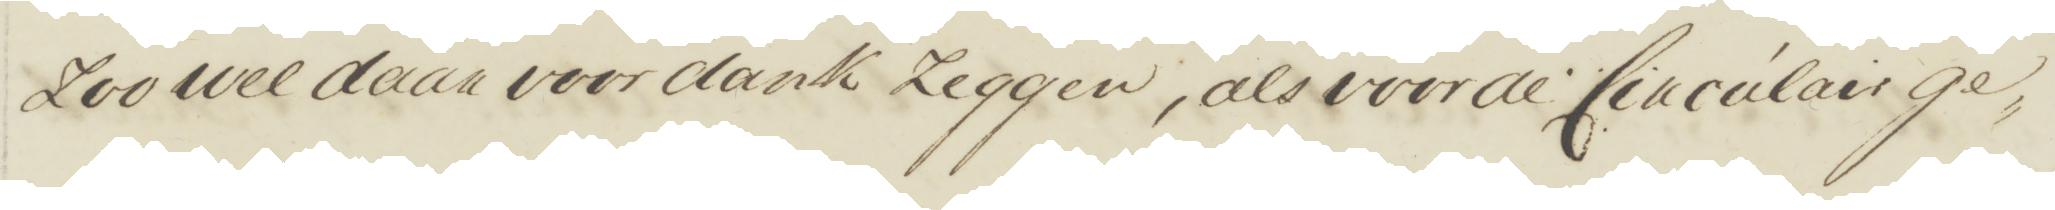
zoo wel daar voor dank zeggen, als voor de Circulair ge„
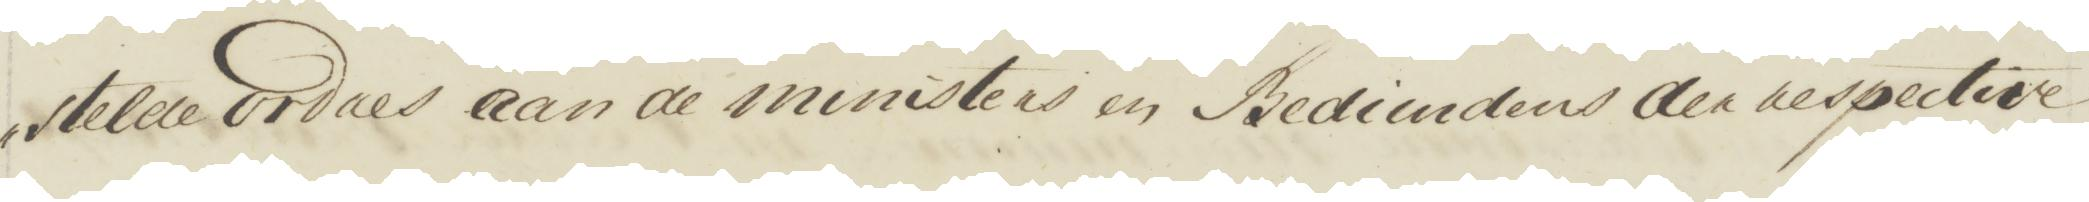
„stelde ordres aan de ministers en Bediendens der respective
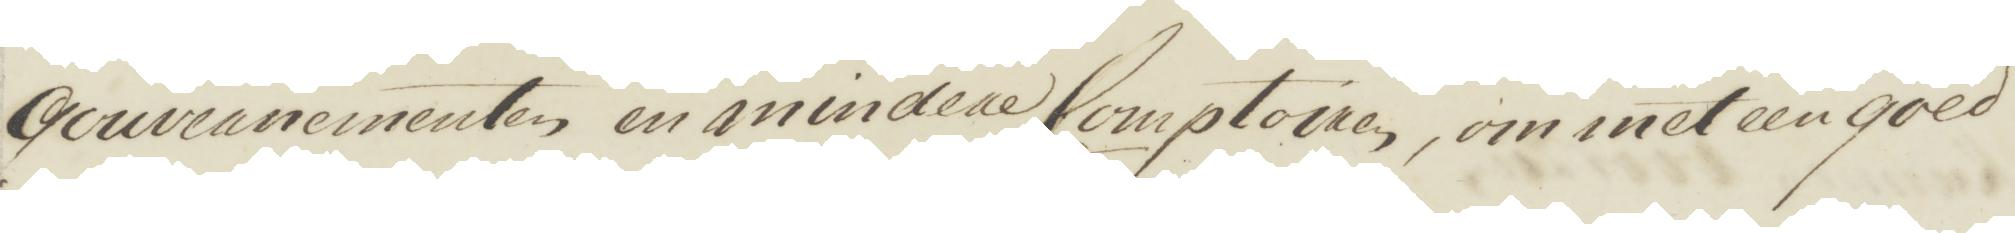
Gouvernementen en mindere Comptoiren, om met een goed
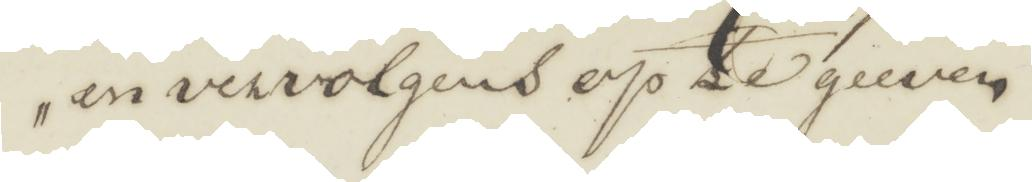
„ en vervolgens op te geeven
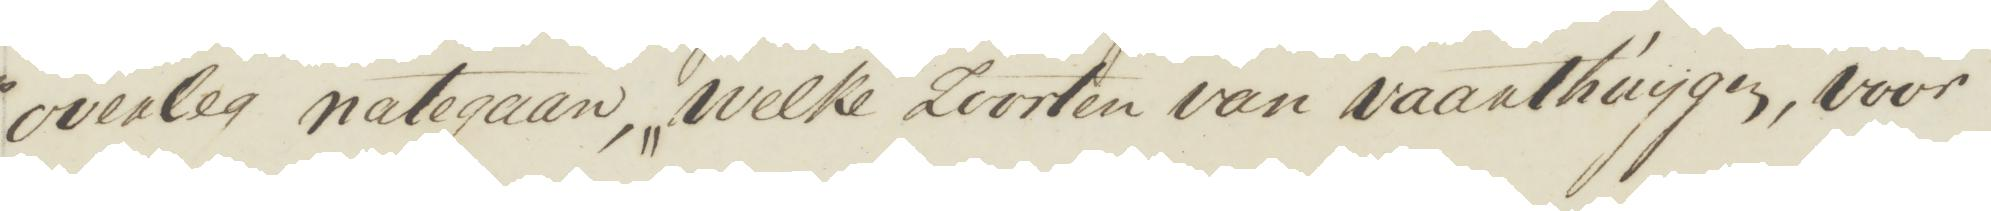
overleg nategaan, „ welke zoorten van vaarthuijgen, voor
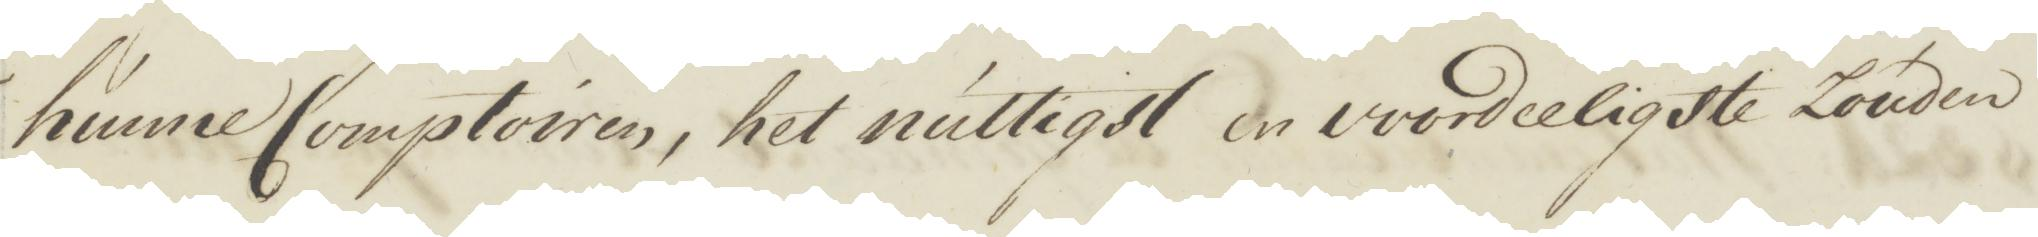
hunne Comptoiren, het nuttigst en voordeeligste zouden
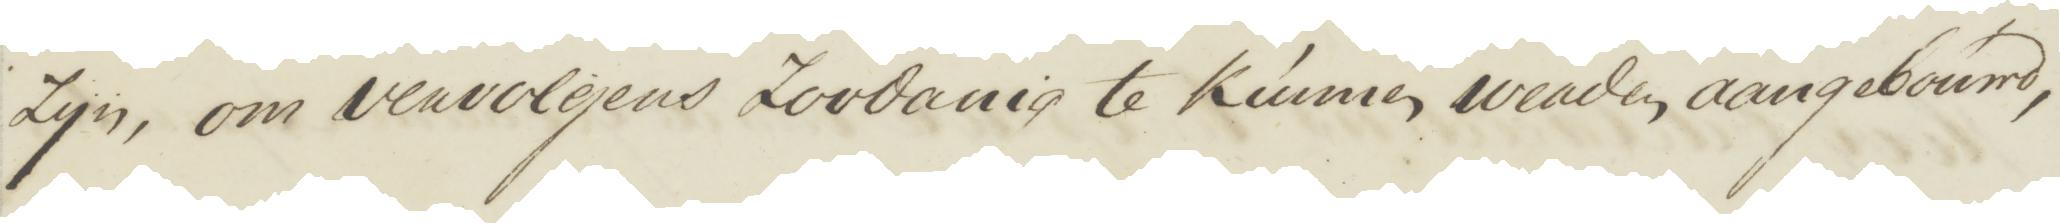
zijn, om vervolgens zoodanig te kunnen werden aangebouwd;
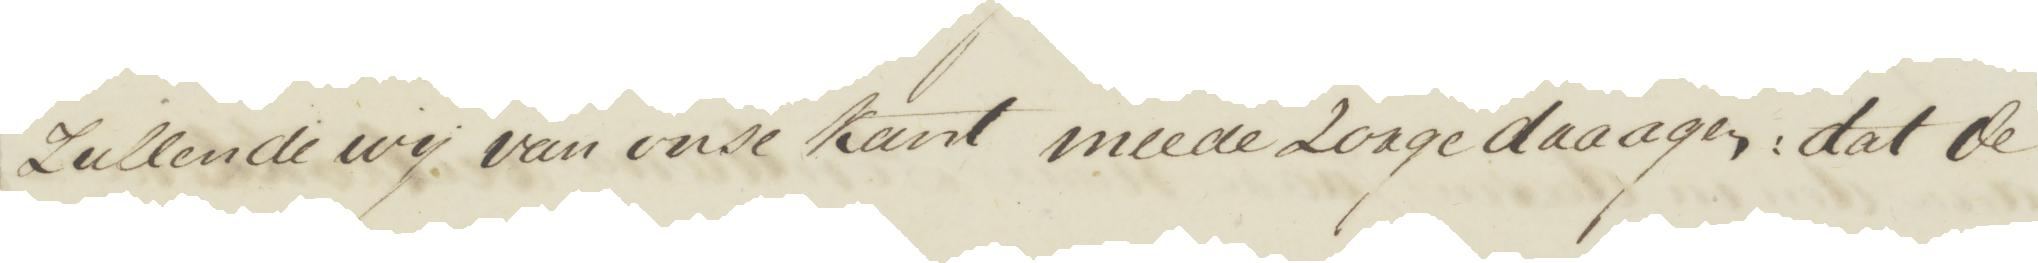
zullende wij van onse kant meede zorge draagen: dat de
